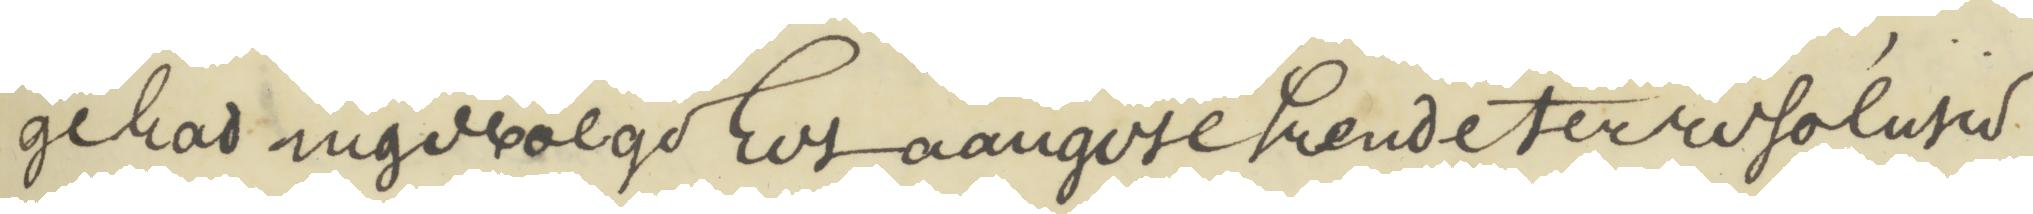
gehad ingevolge het aangetekende ter resolutie
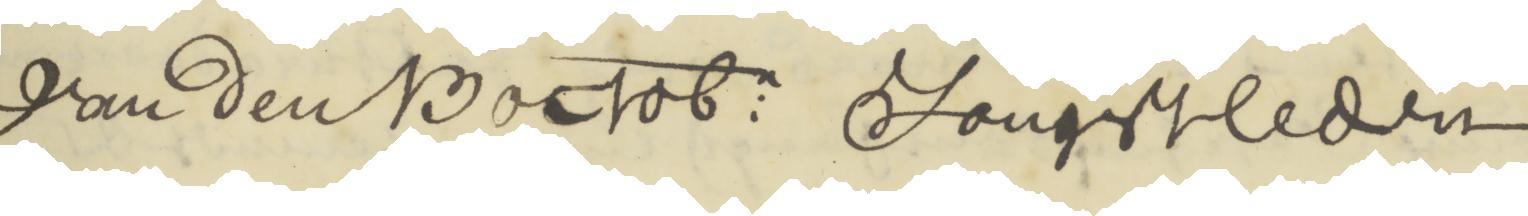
van den 13 octb:r Iongstleden
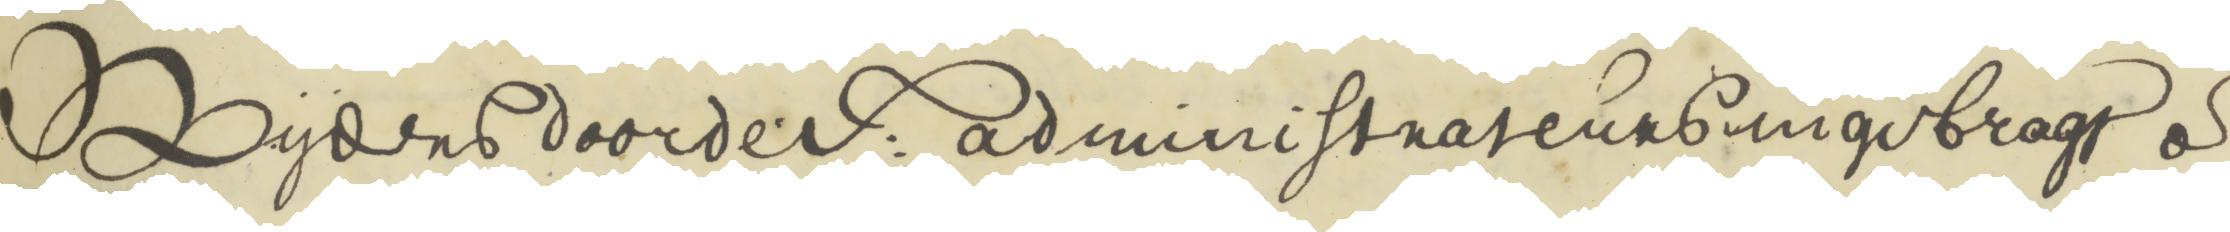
Wijders door de E: administrateurs ingebragt de
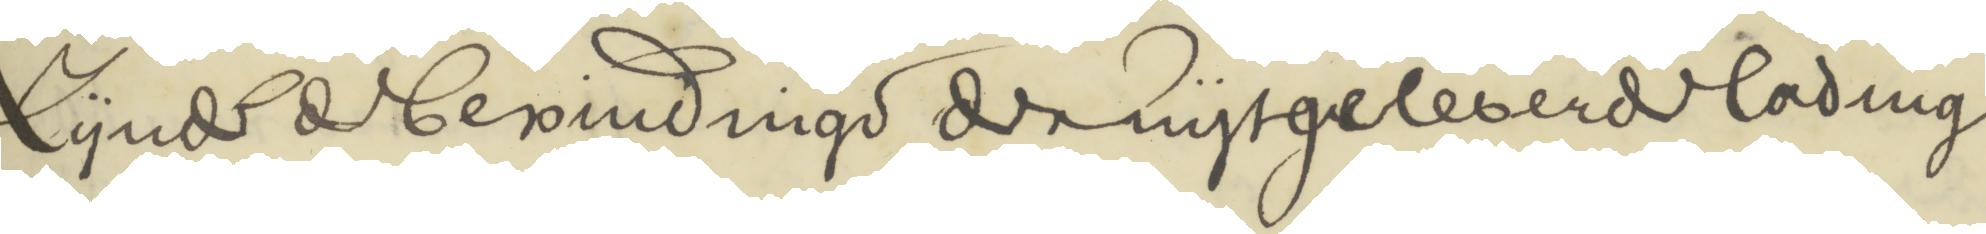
zijnde de bevindinge der uijtgeleverde lading
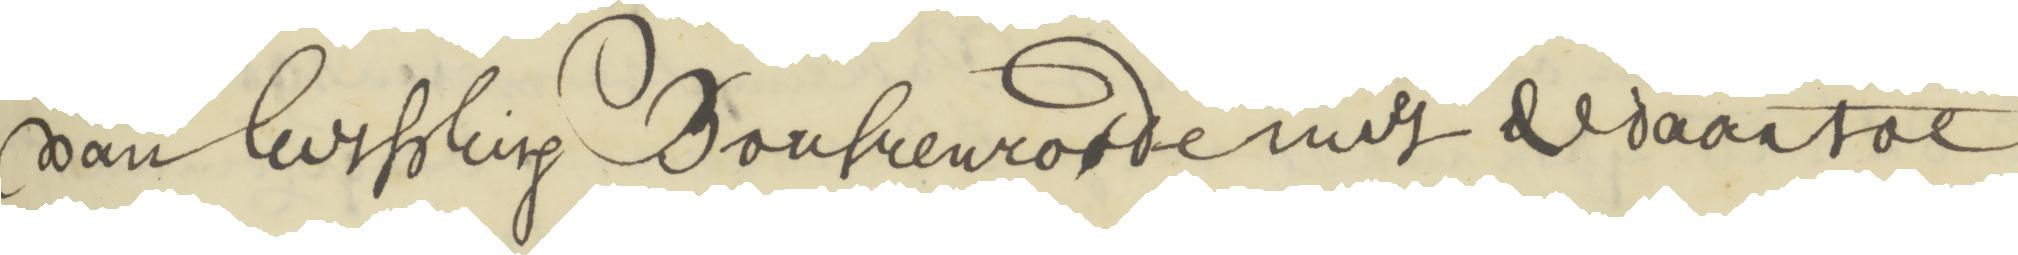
van het schip Boukenroode met de daartoe
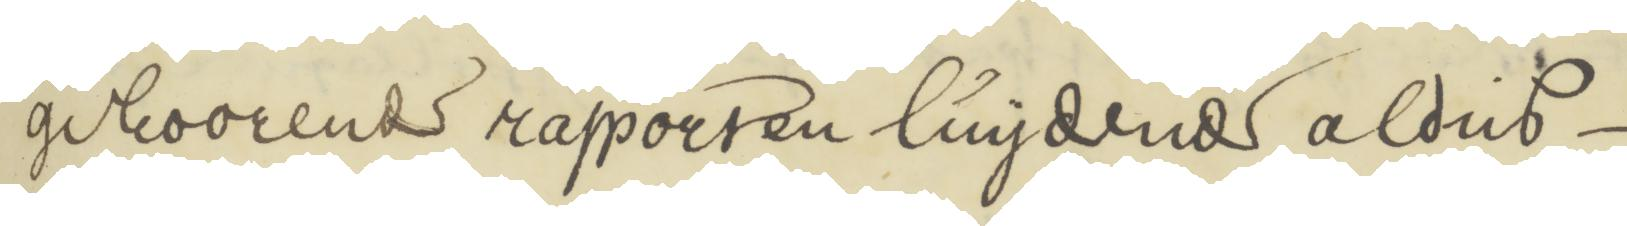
gehoorende rapporten luijdende aldus —
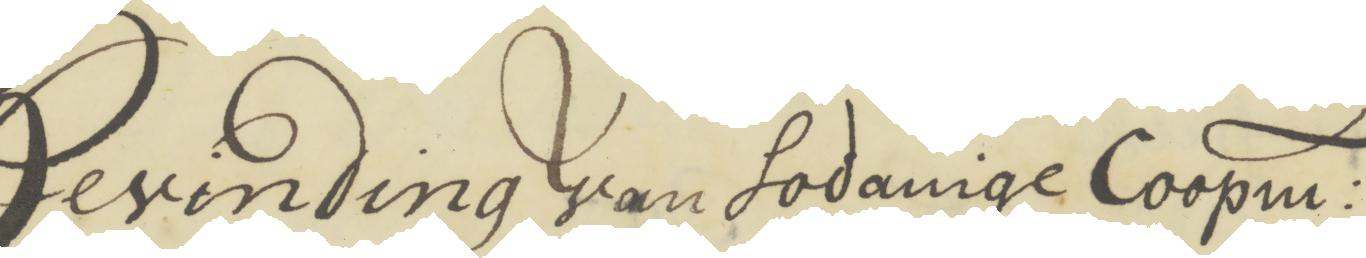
Bevinding van sodanige coopm:
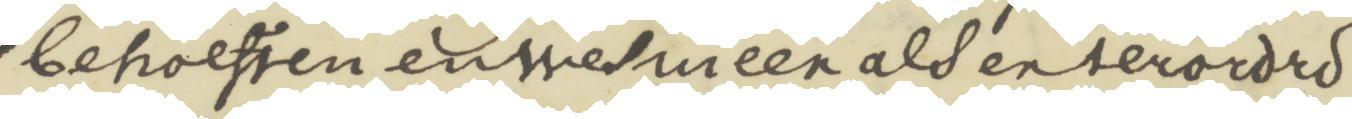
behoeften en wes meer als er terordre
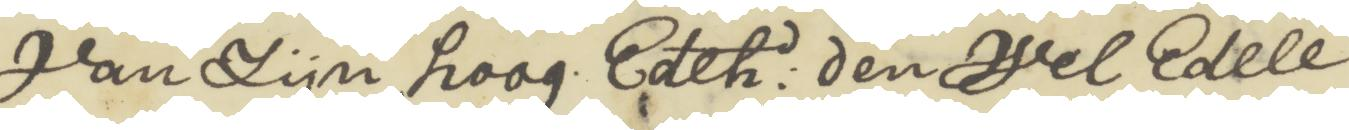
van zijn hoog Edlh:e den Wel Edele
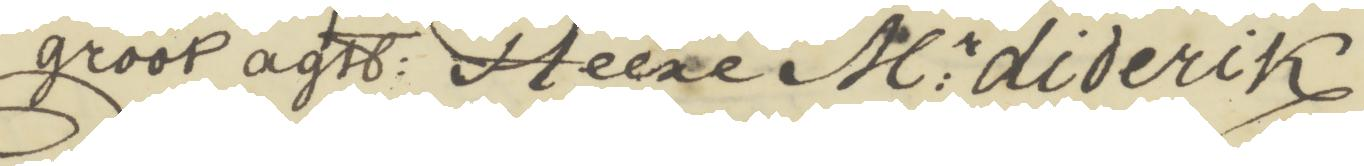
groot Agtb: Heere M:r diderik
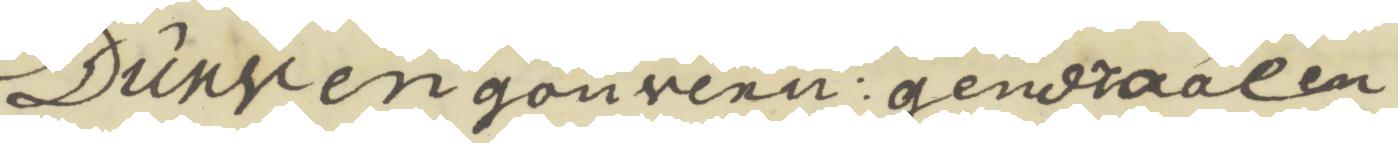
Durv en gouvern: generaalen
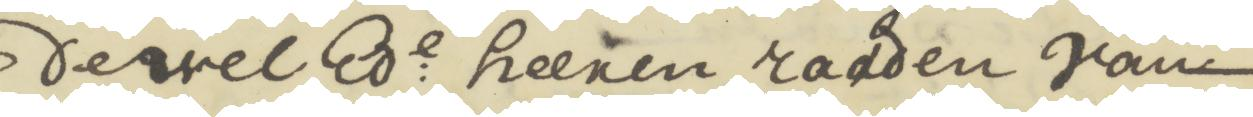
de wel Ed:e heeren raaden van
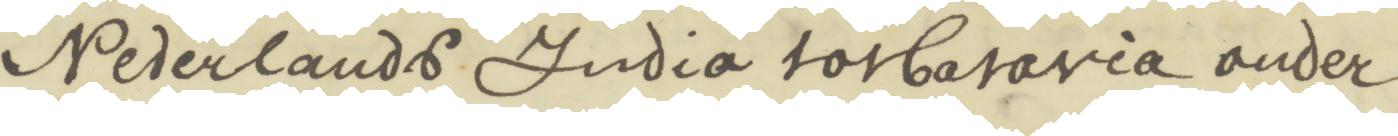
Nederlands Jndia tot batavia onder
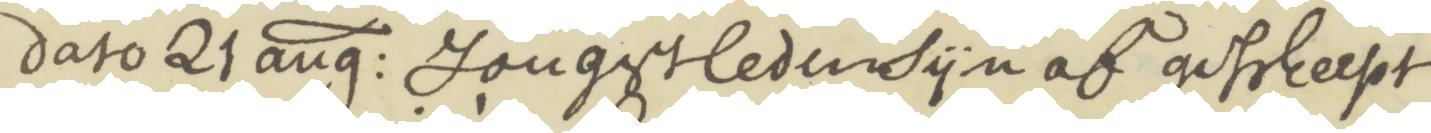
dato 21 aug: jongstleden sijn af gescheept
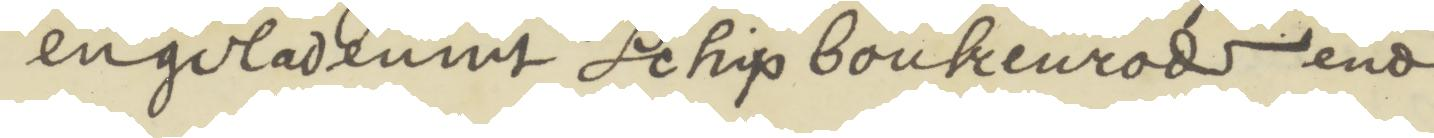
en geladen in't schip boukenrode ende
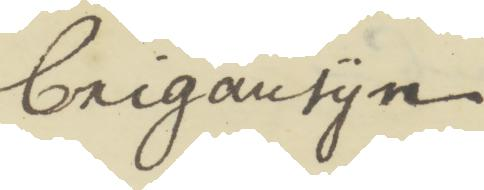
brigantijn
